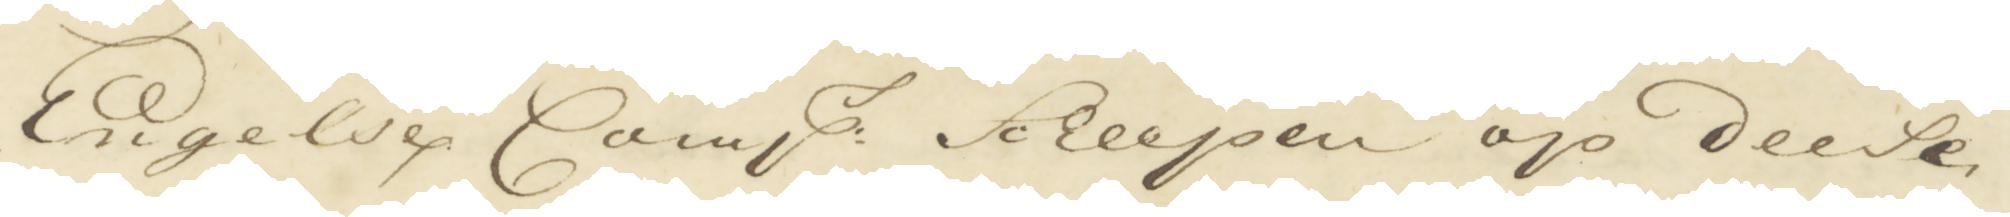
Engelse Comp:s scheepen op deese
